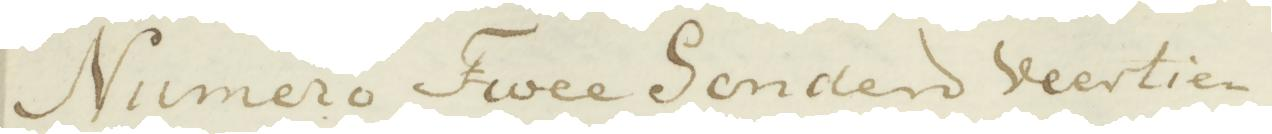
Numero Twee Honderd Veertien
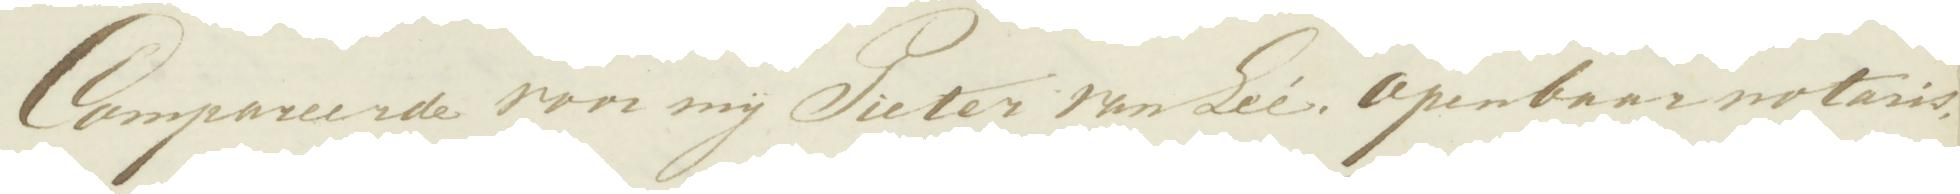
Compareerde voor mij Pieter van Leé, Openbaar notaris,
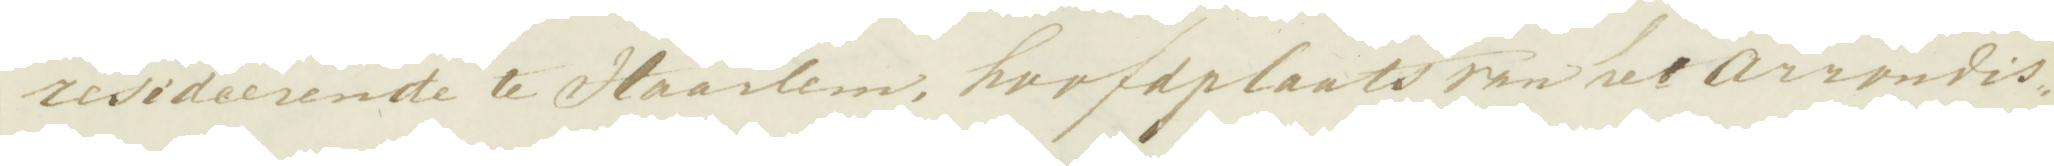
resideerende te Haarlem, hoofdplaats van het Arrondis„
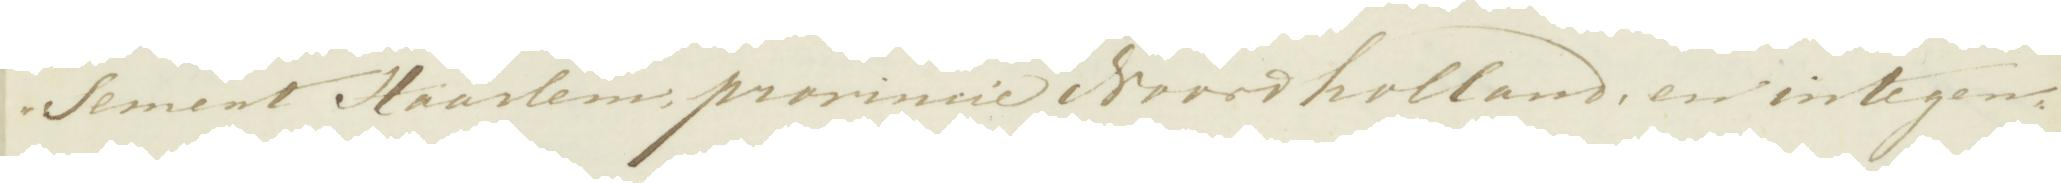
„sement Haarlem, provincie Noord holland, en in tegen„
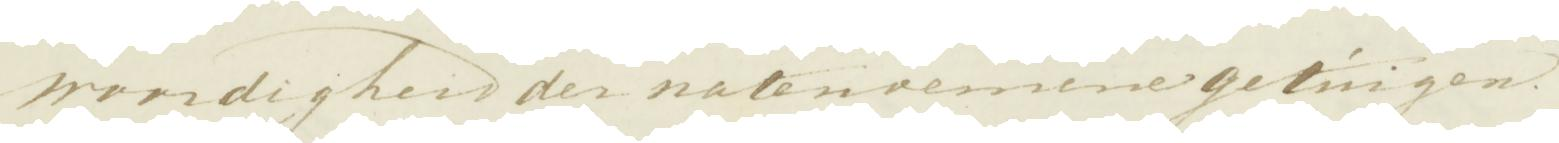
woordigheid der na te noemene getuigen.
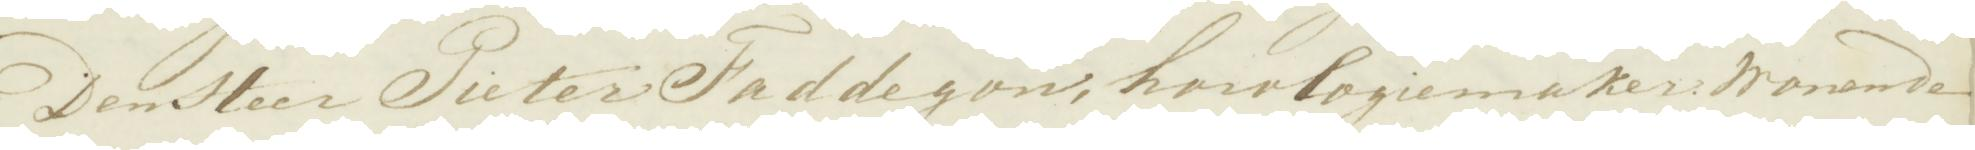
Den Heer Pieter Faddegon, horologiemaker, wonende
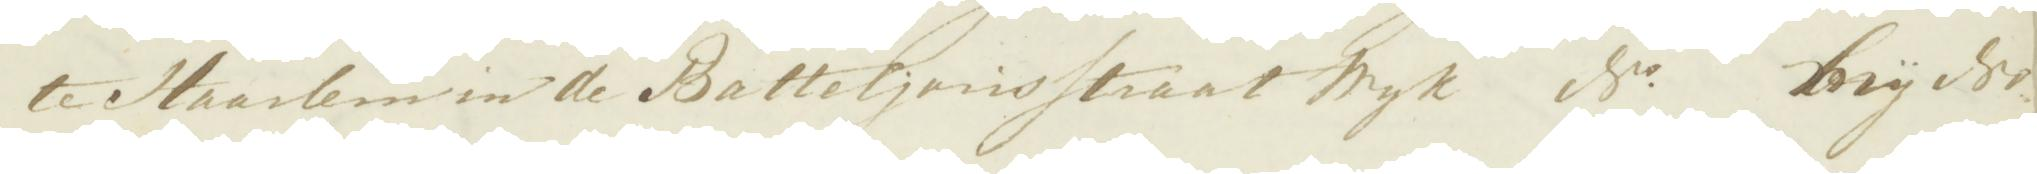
te Haarlem in de Batteljorisstraat Wyk N.o bij No„
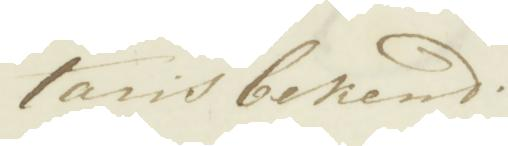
taris bekend. —
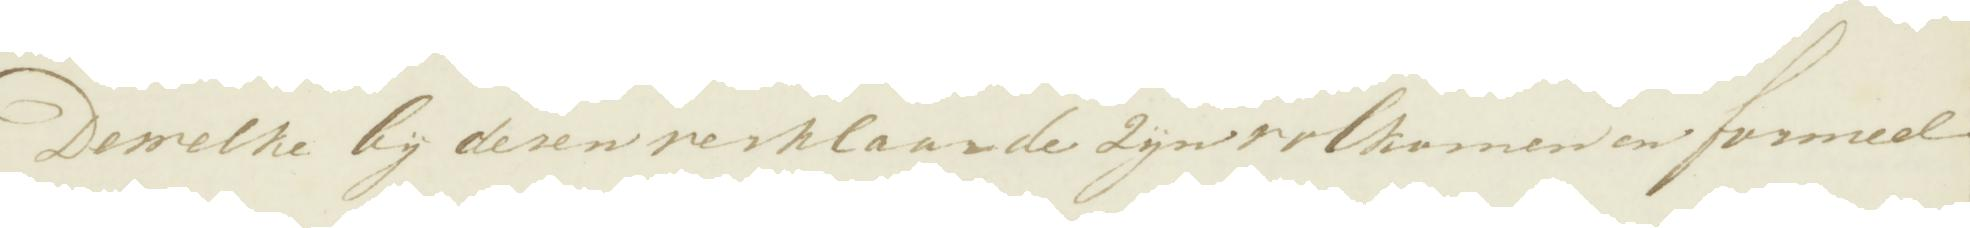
Dewelke bij dezen verklaarde zijn volkomen en formeel
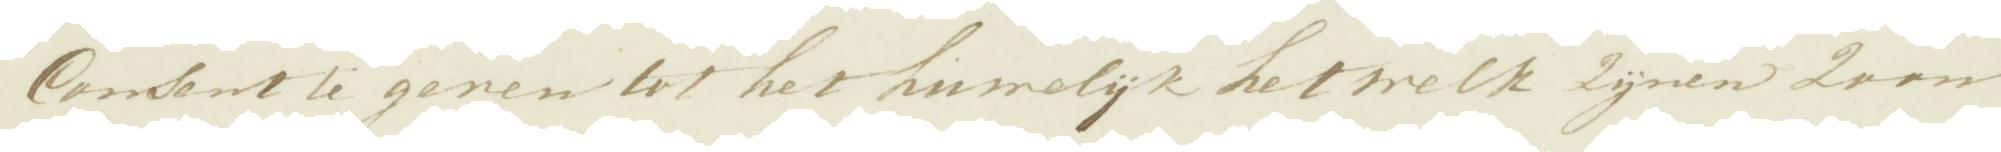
Consent te geven tot het huwelijk het welk zijnen zoon
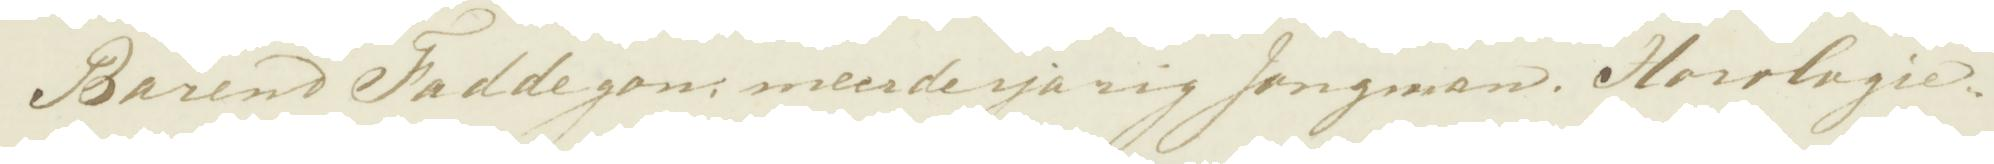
Barend Faddegon, meerderjarig Jongman, Horologie„
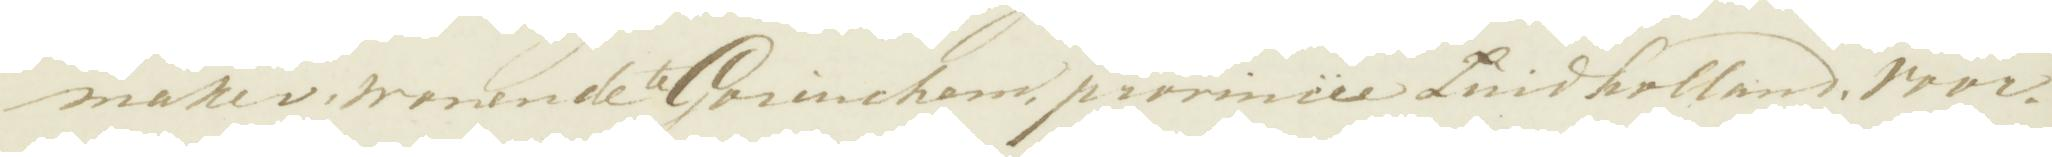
maker, wonende te Gorinchem, provincie Zuid holland, voor„
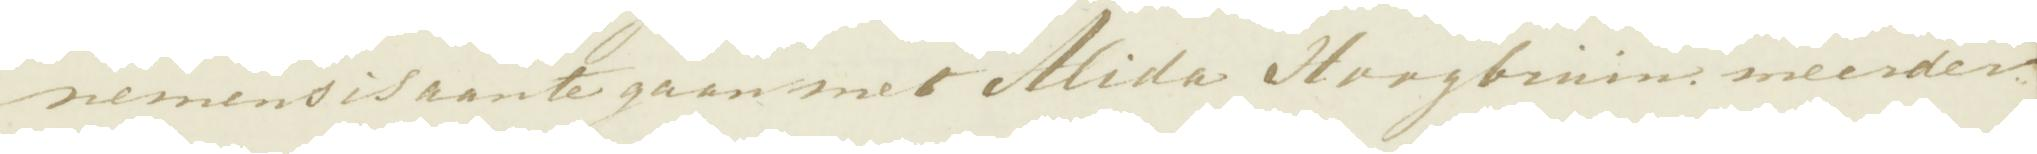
nemens is aan te gaan met Alida Hoogbruin, meerder„
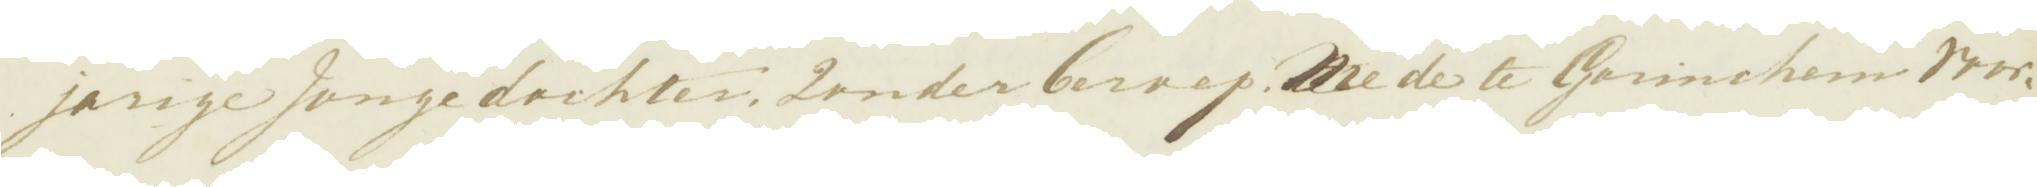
„jarige Jonge dochter, zonder beroep, Mede te Gorinchem Voor„
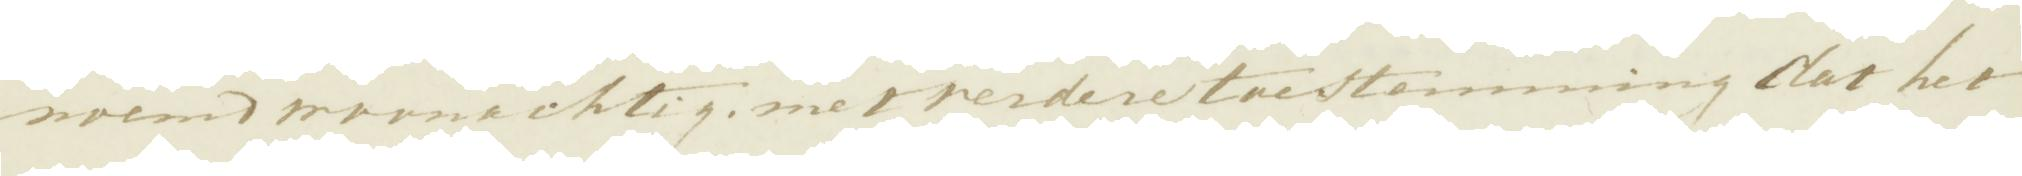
noemd woonachtig, met verdere toestemming dat het
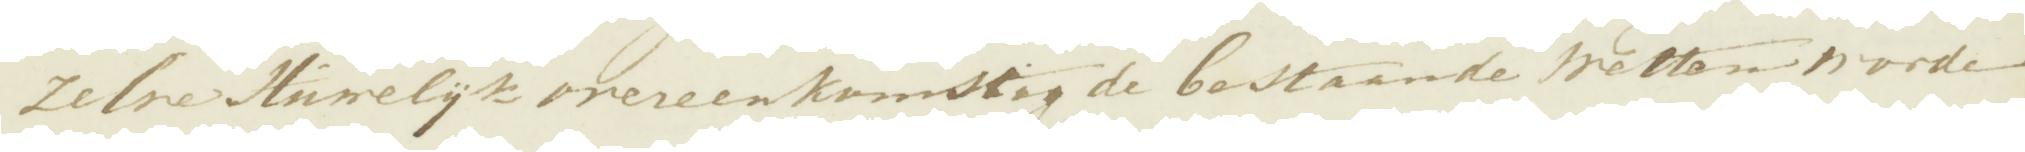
zelve Huwelijk overeenkomstig de bestaande Wetten worde
